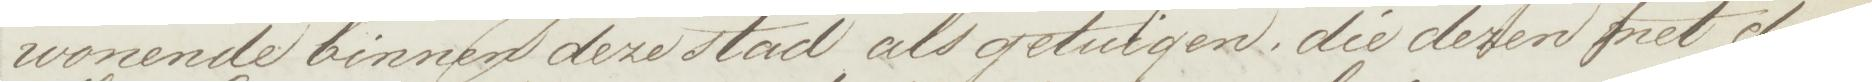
wonende binnen deze stad als getuigen, die dezen met den
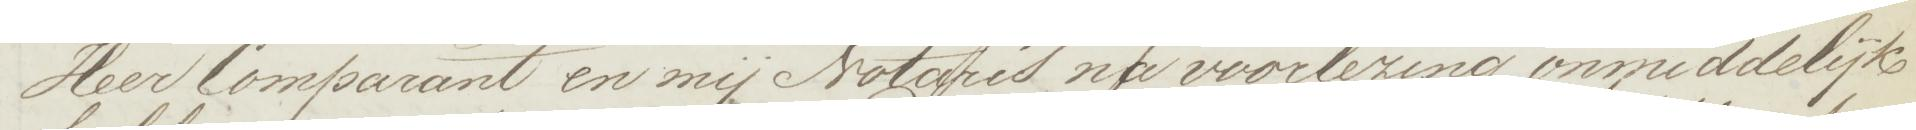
Heer Comparant en mij Notaris na voorlezing onmiddelijk
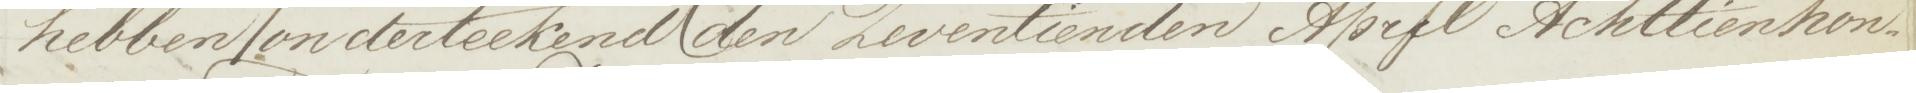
hebben onderteekend den Zeventienden April Achttienhon„
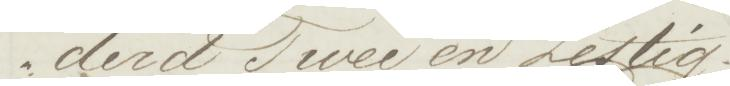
„derd Twee en Zestig.
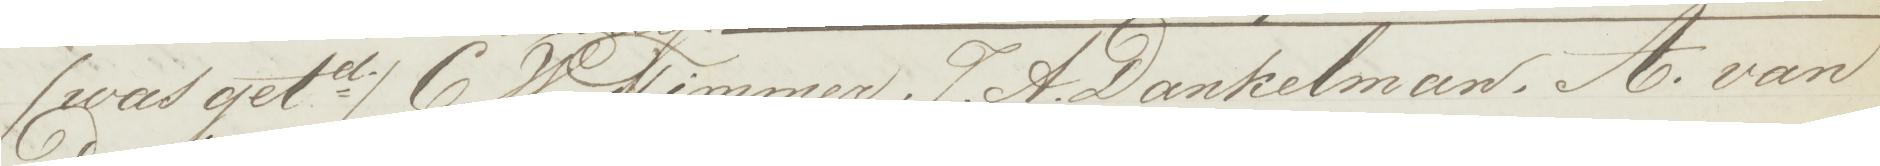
/was get=d C: W Timmer, J A Dankelman, A. van
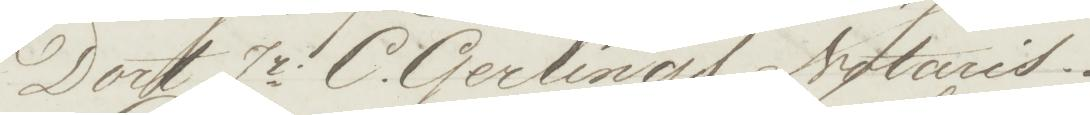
Dort J=r. C. Gerlings Notaris.
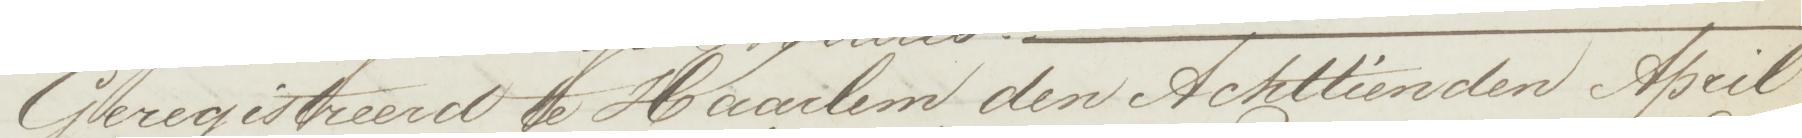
Geregistreerd te Haarlem den Achttienden April
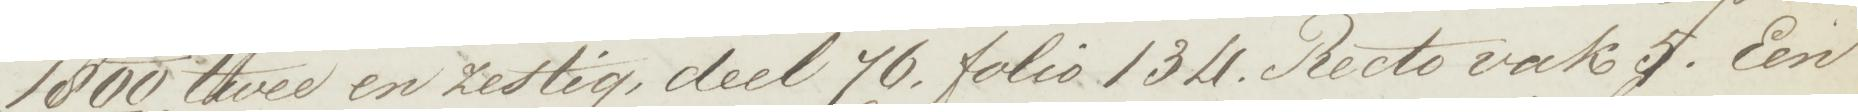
1800 twee en zestig, deel 76, folio 134. Recto vak 5. Een
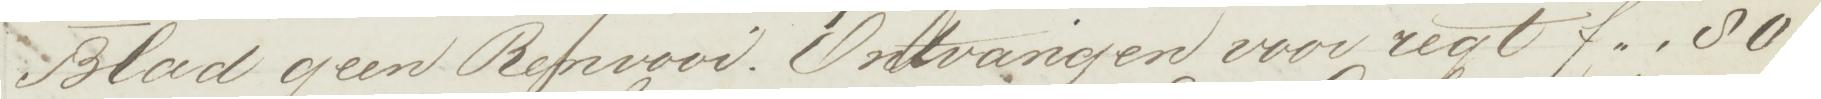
Blad geen Renvooi. Ontvangen voor regt ƒ „, 80,
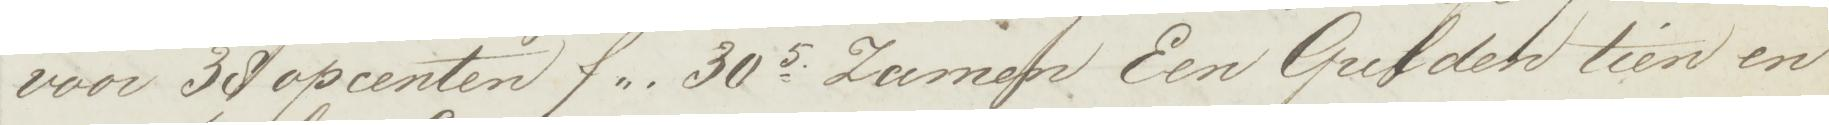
voor 38 opcenten ƒ„. 30:5 zamen Een Gulden tien en
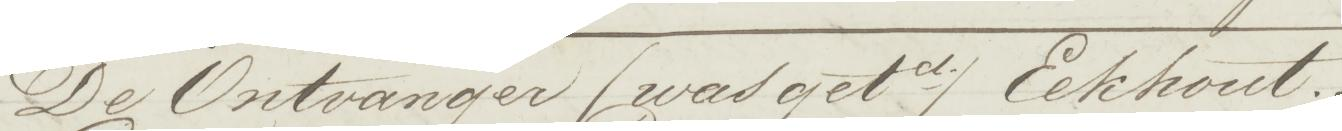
De Ontvanger / was get: Eekhout.
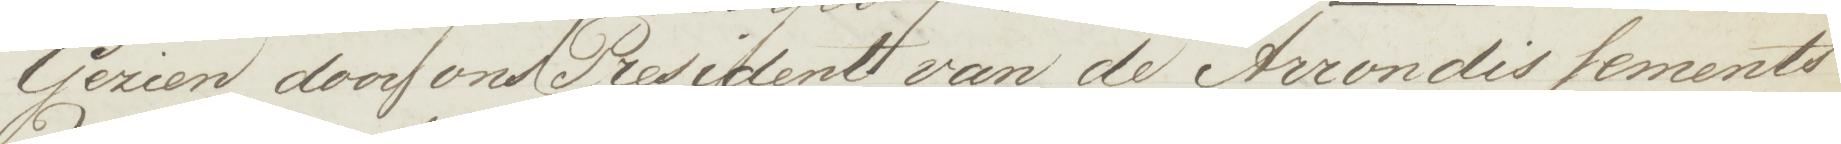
Gezien door ons President van de Arrondissements
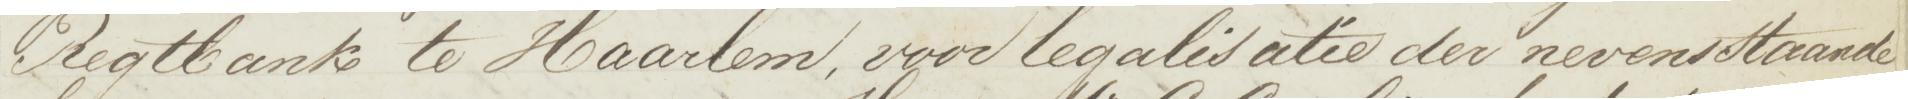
Regtbank te Haarlem, voor legalisatie der nevensstaande
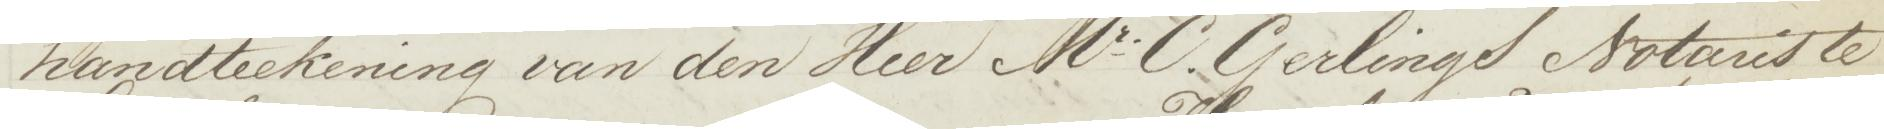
handteekening van den Heer M-r C. Gerlings Notaris te
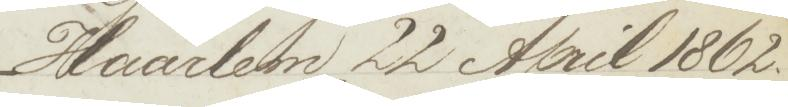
Haarlem 22 April 1862.
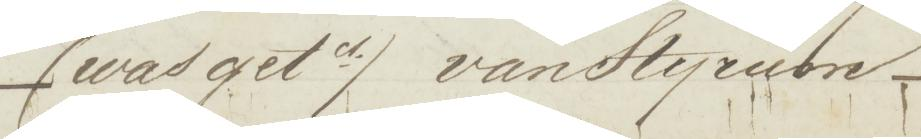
(was get:d / van Styrum
